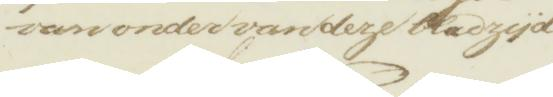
van onder van deze bladzijde
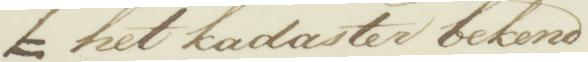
¶ het kadaster bekend
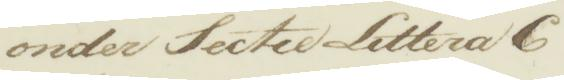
onder Sectie Littera C
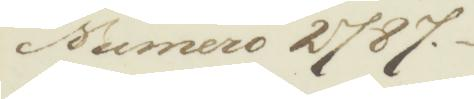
Numero 2787.
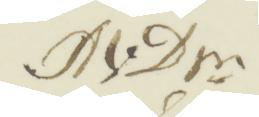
AV Djr
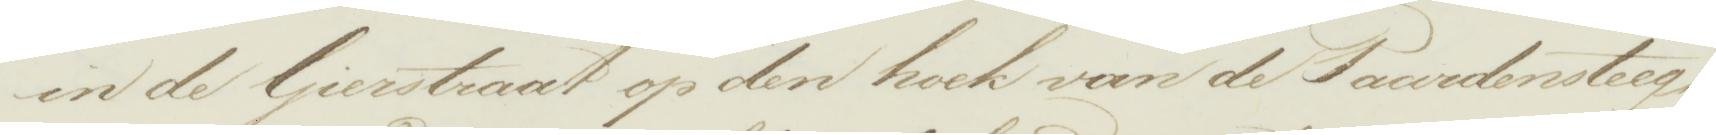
in de Gierstraat op den hoek van de Paardensteeg,
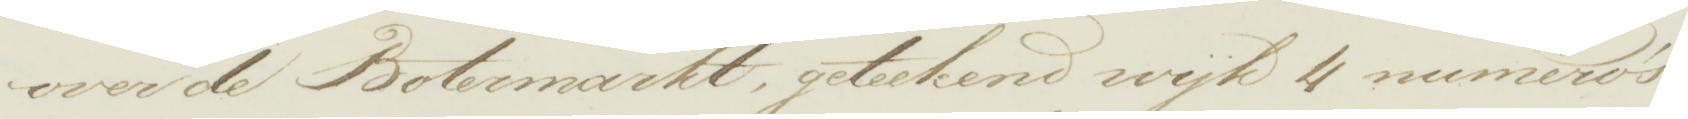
over de Botermarkt, geteekend wijk 4 numero's
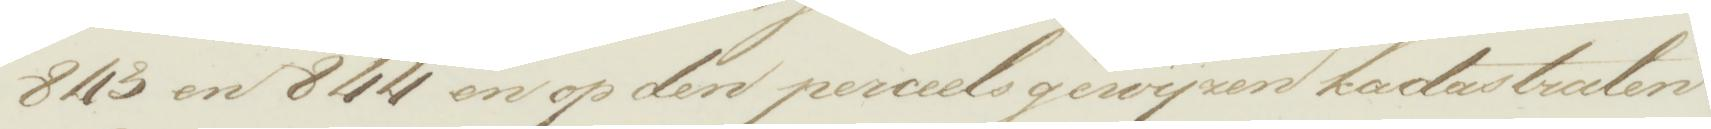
843 en 844 en op den perceels gewijzen kadastralen
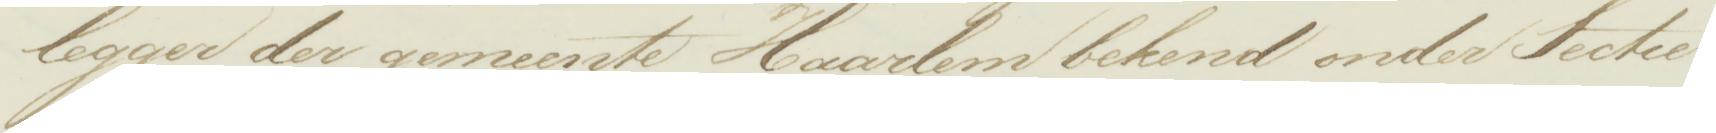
legger der gemeente Haarlem bekend onder Sectie
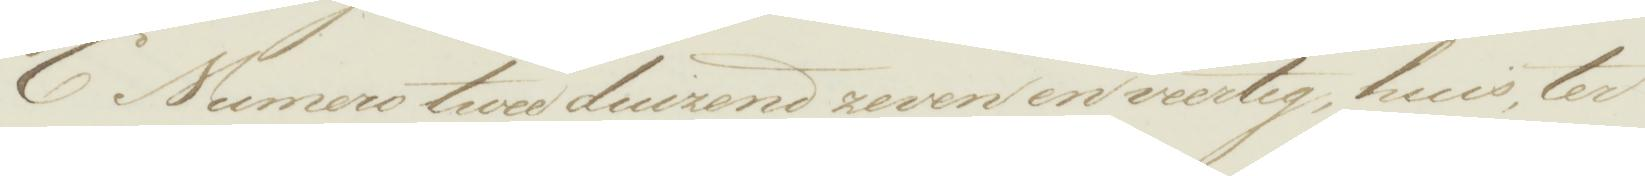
C Numero twee duizend zeven en veertig, huis, ter
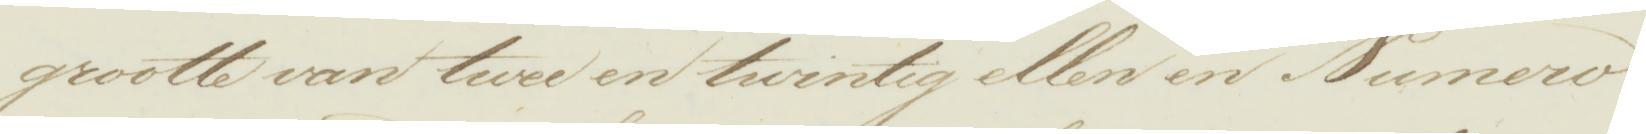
grootte van twee en twintig ellen en Numero
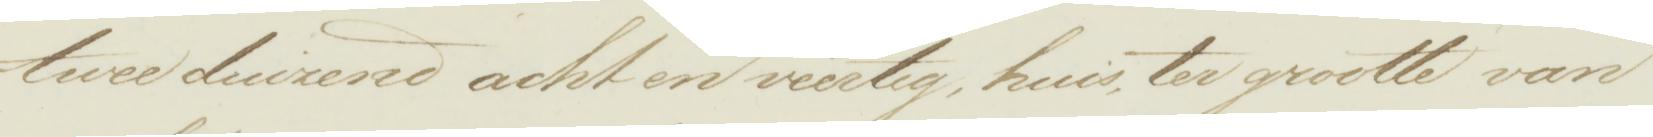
twee duizend acht en veertig, huis, ter grootte van
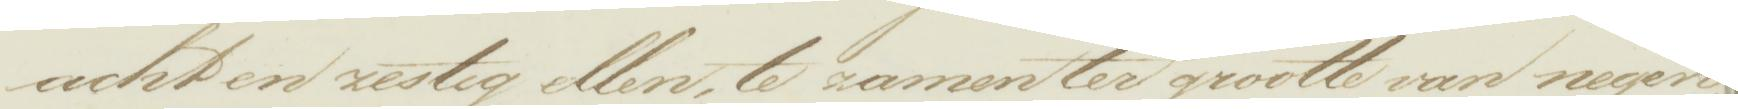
acht en zestig ellen, te zamen ter grootte van negen
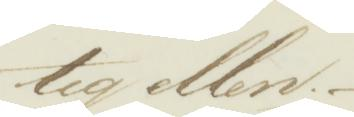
tig ellen.
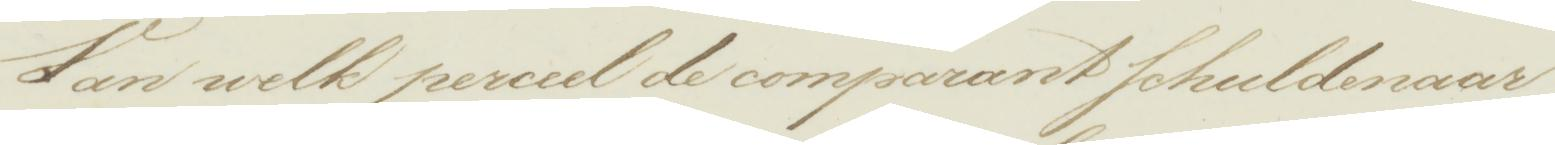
Van welk perceel de comparant schuldenaar
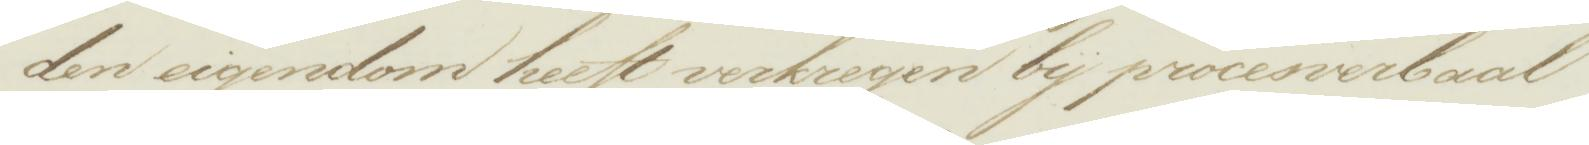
den eigendom heeft verkregen bij procesverbaal
